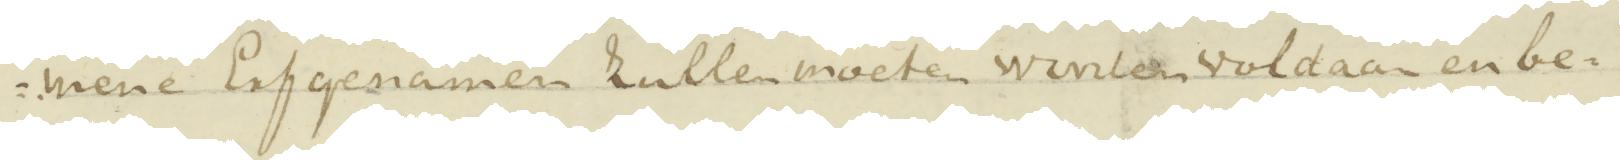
=mene Erfgenamen zullen moeten worden voldaan en be=
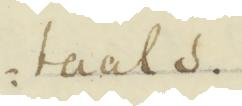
=taald.
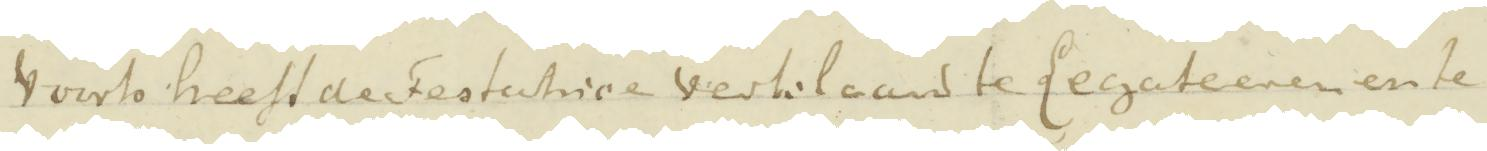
Voorts heeft de Testatrice verklaard te Legateeren en te
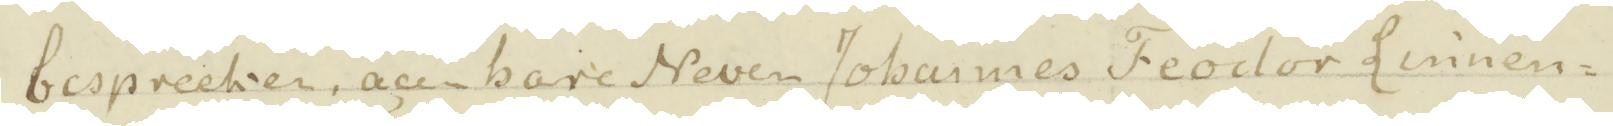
bespreeken aan hare Neven Johannes Teodor Linnen=
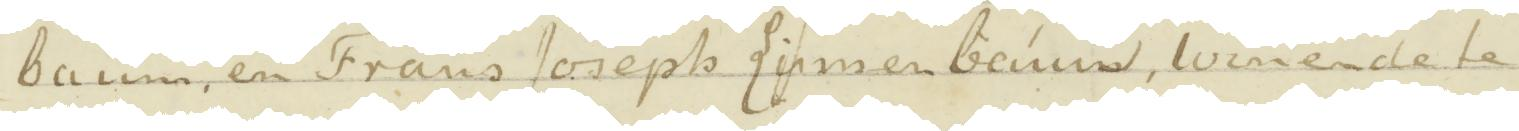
baum, en Frans Joseph Linnenbaum, wonende te
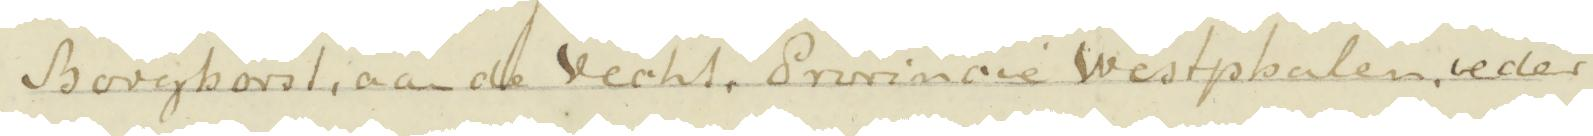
Borghorst, aan de Vecht, Provincie Westphalen, ieder
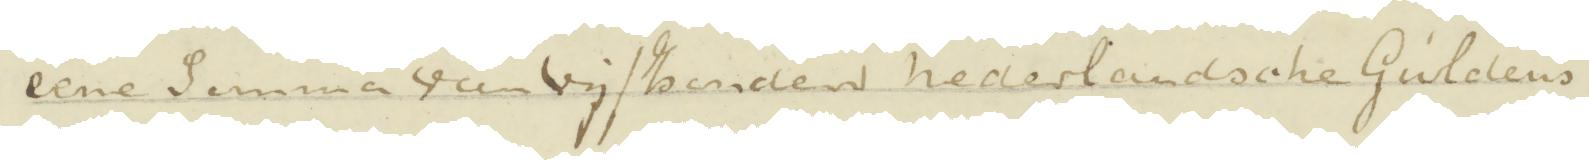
eene somma van vijfhonderd nederlandsche Guldens
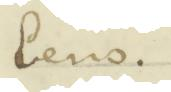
Eens.
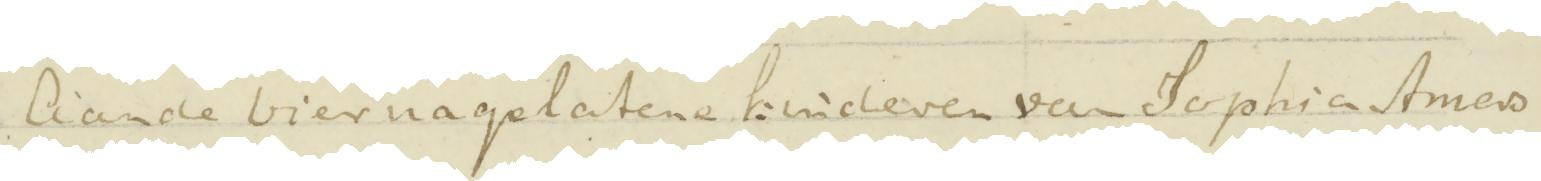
Aan de vier nagelatene kinderen van Sophia Amers
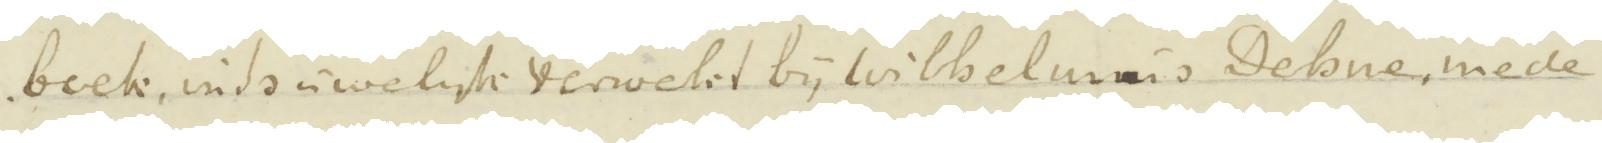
beek, in huwelijk verwekt bij Wilhelmus Dehne, mede
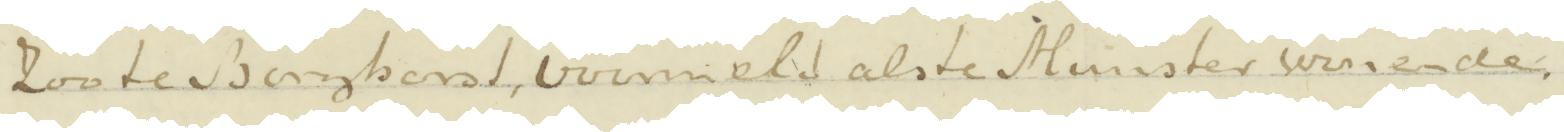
zoo te Borghorst, voormeld als te Munster wonende.
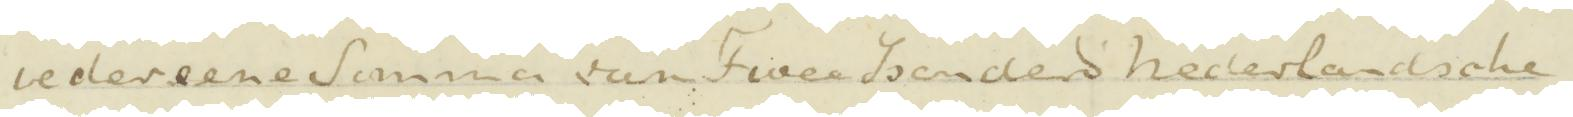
ieder eene somma van Twee honderd nederlandsche
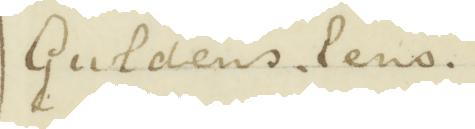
Guldens, Eens.
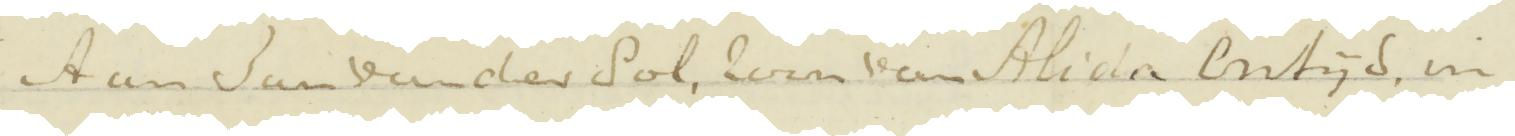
Aan Ian van der Pol, zoon van Alida Ontijd,in
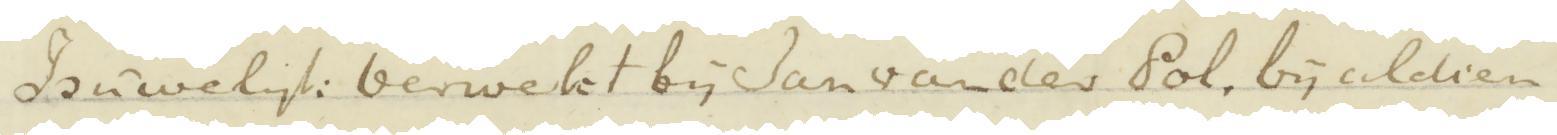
huwelijk verwekt bij Ian van der Pol, bij aldien
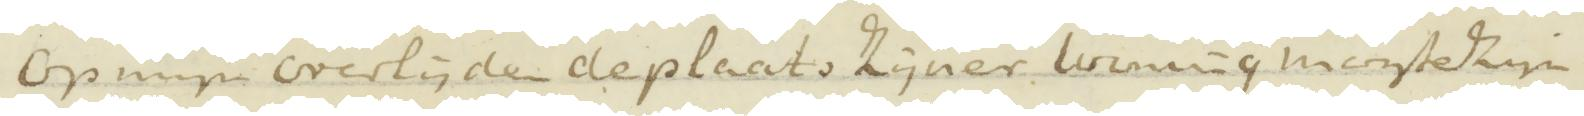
op mijn overlijden de plaats zijner woning mogte zijn
